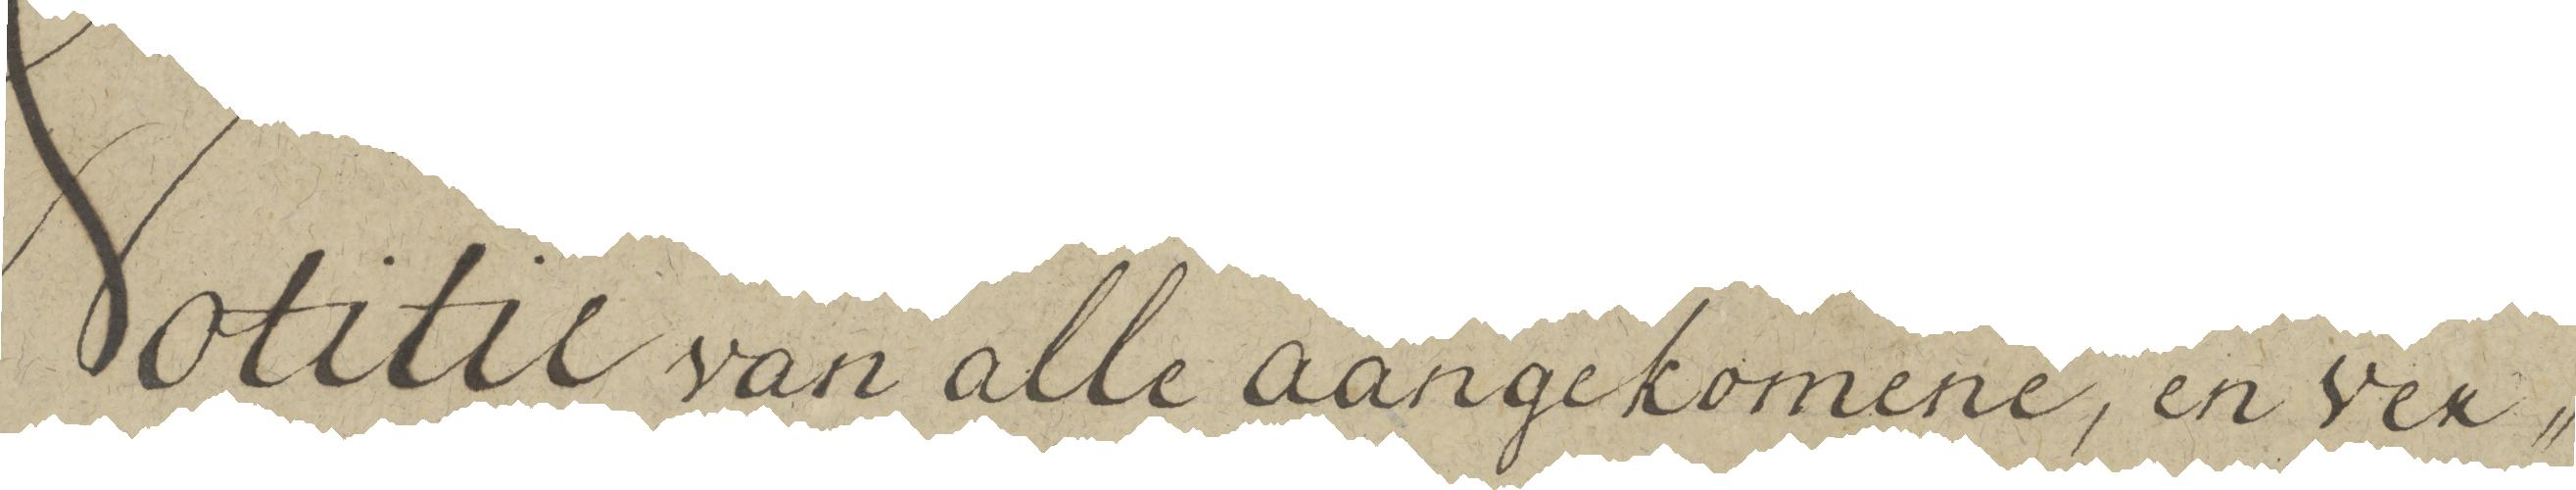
Notitie van alle aangekomene, en ver„
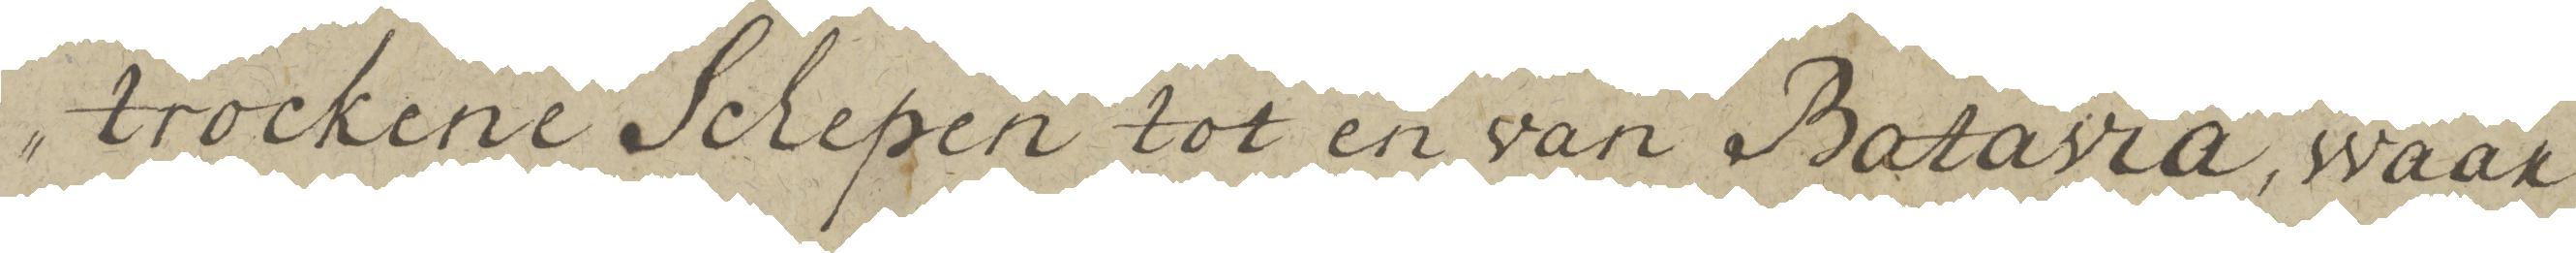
„trockene schepen tot en van Batavia, waar
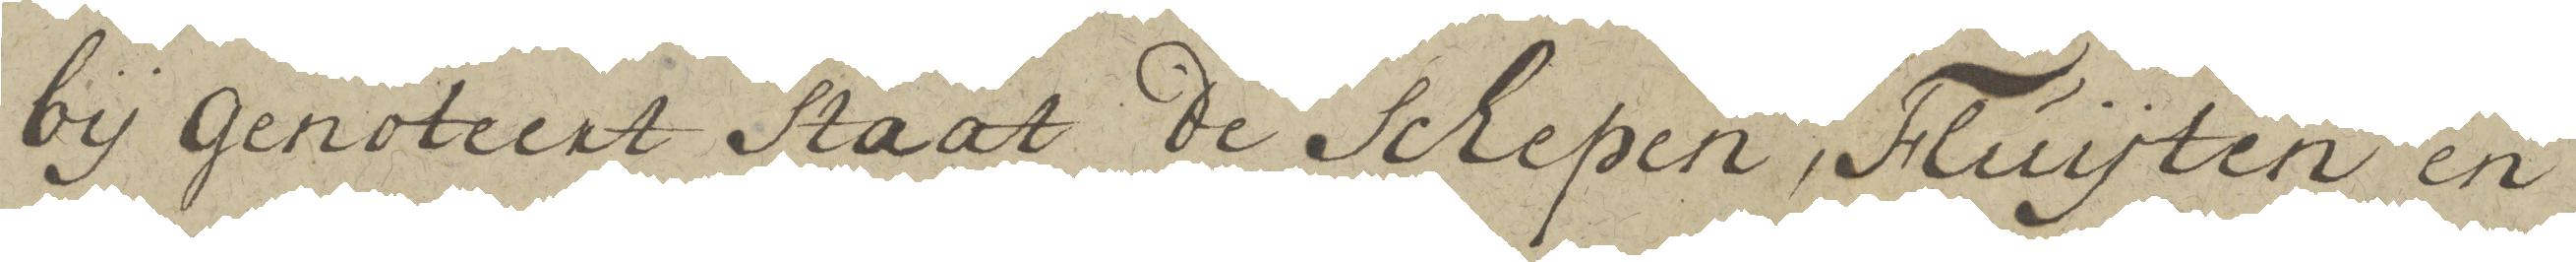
bij genoteert staat de schepen, Fluijten en
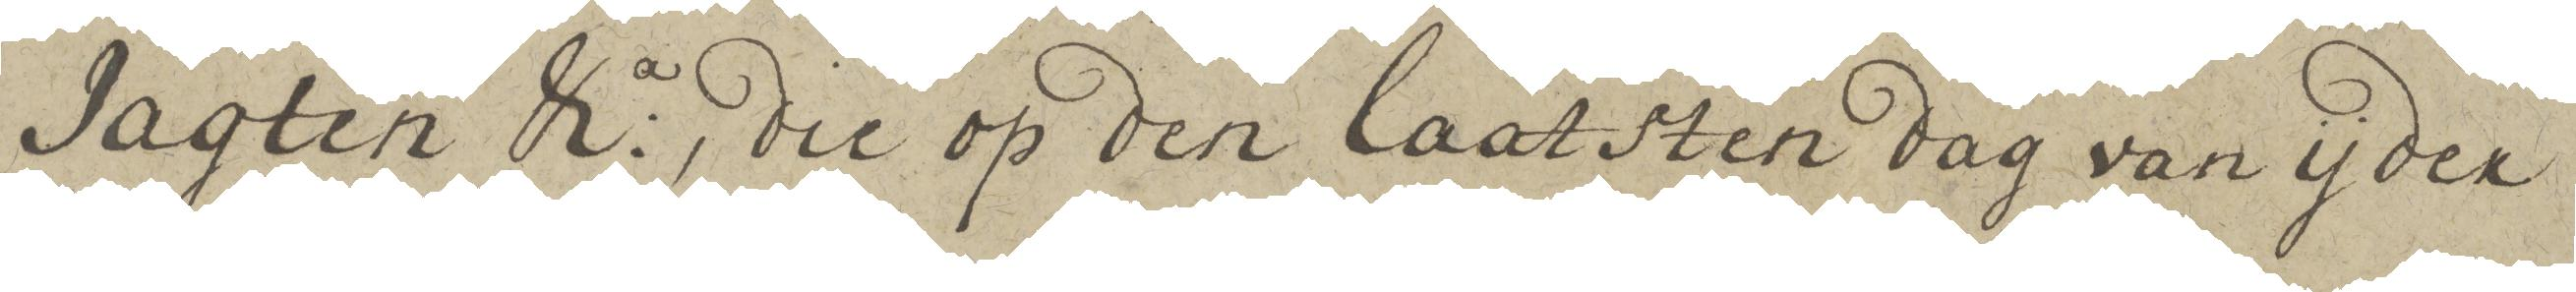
Jagten &:a, die op den laatsten dag van ijder
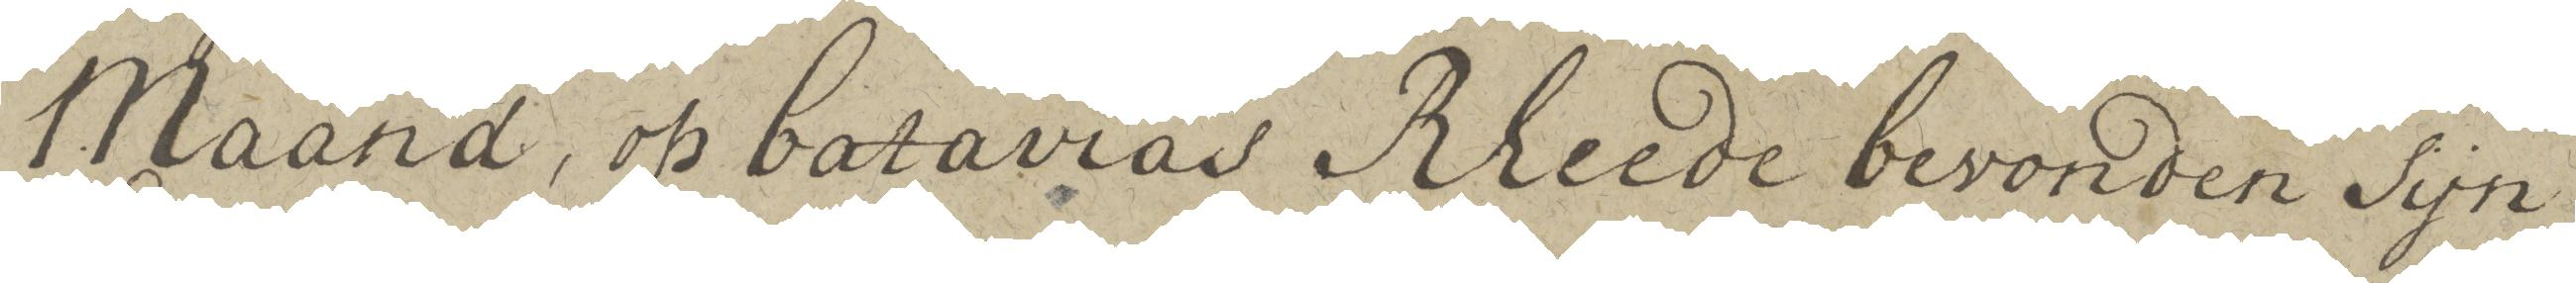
Maand, op batavias Rheede bevonden sijn,
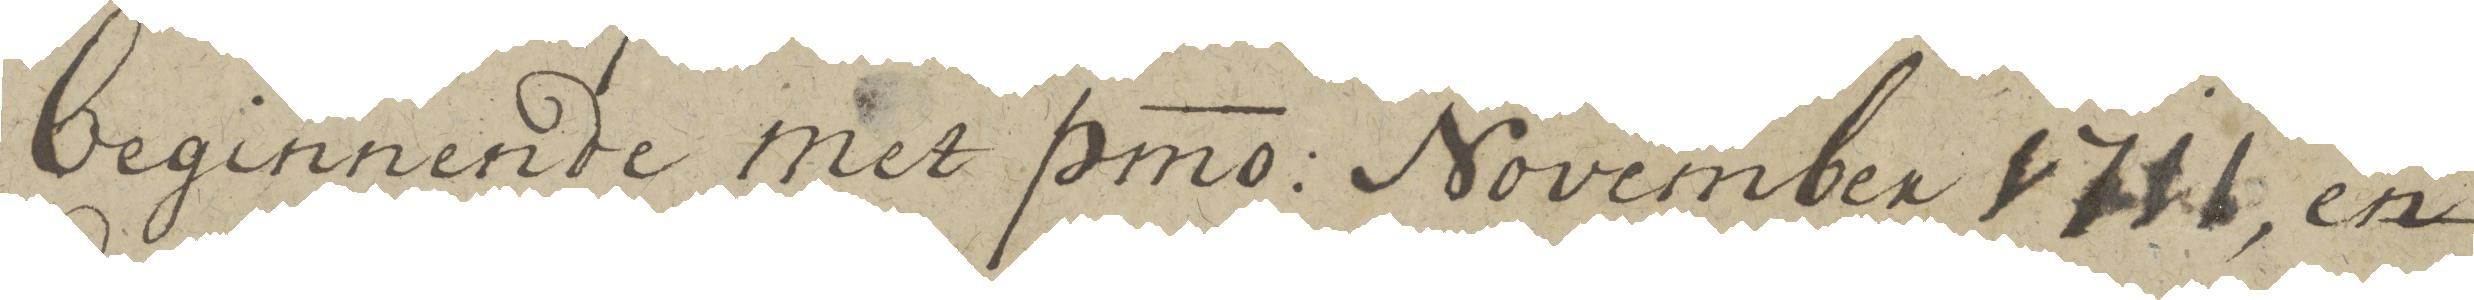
beginnende met pmo: November 1711, en
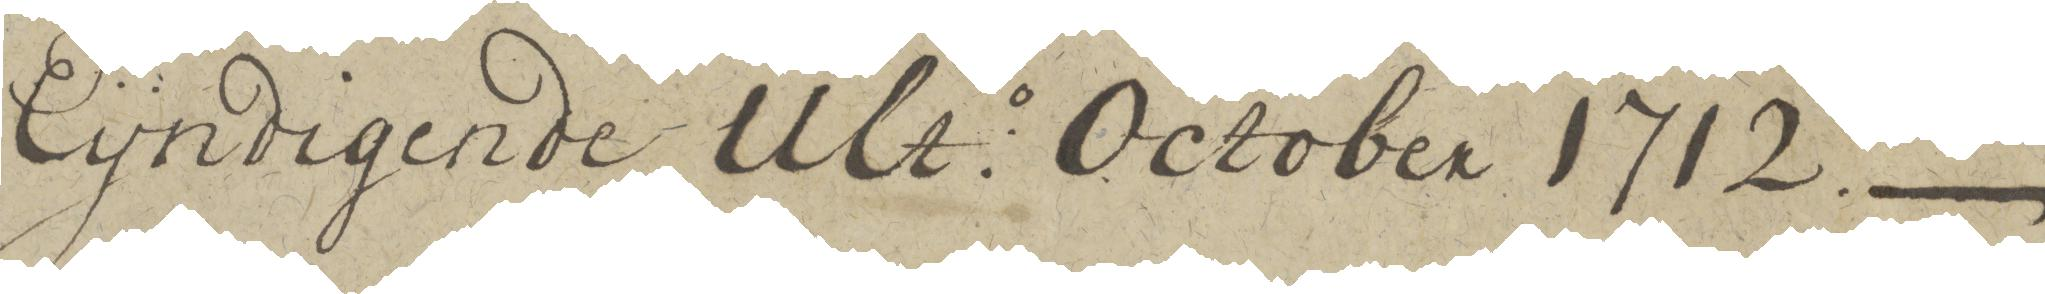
Eijndigende Ult:o October 1712.
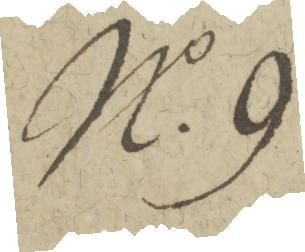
No. 9
